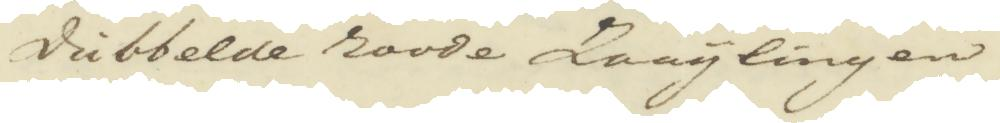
Dubbelde roode Zaaijlingen
